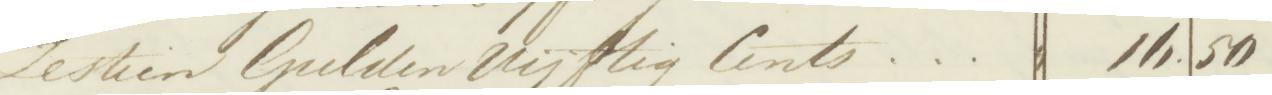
Zestien Gulden Vijftig Cents . . . „ 16.50
